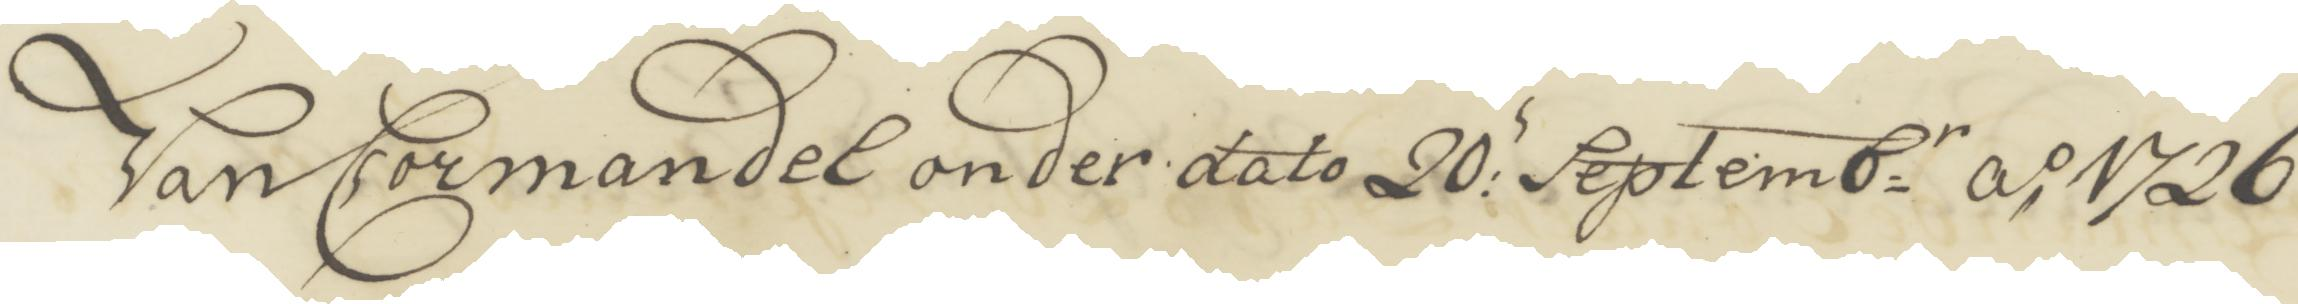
Van Cormandel onder dato 20:' Septemb=r a„o 1726
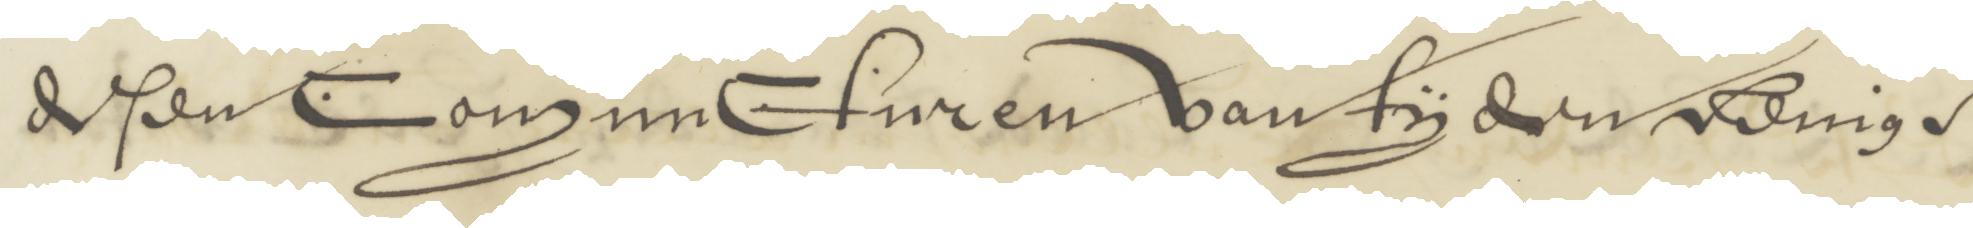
desen Conjuncturen Van tijden Eenige
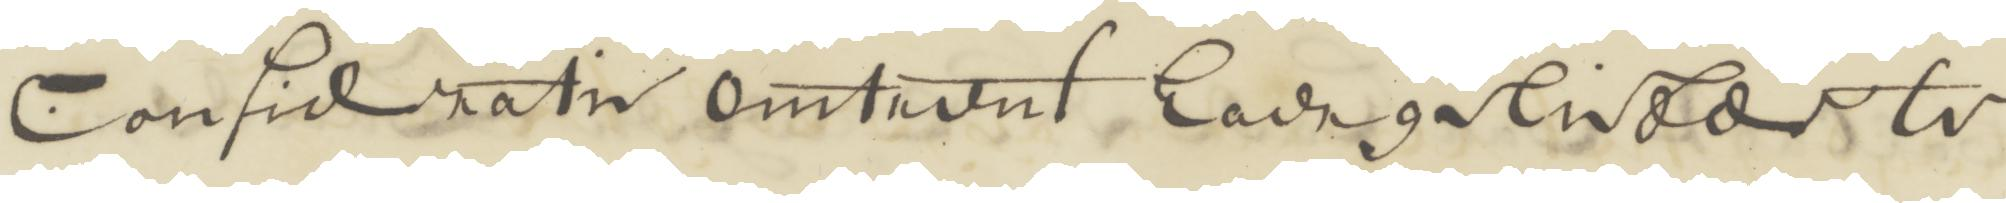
Consideratie omtrent haer geliefde te
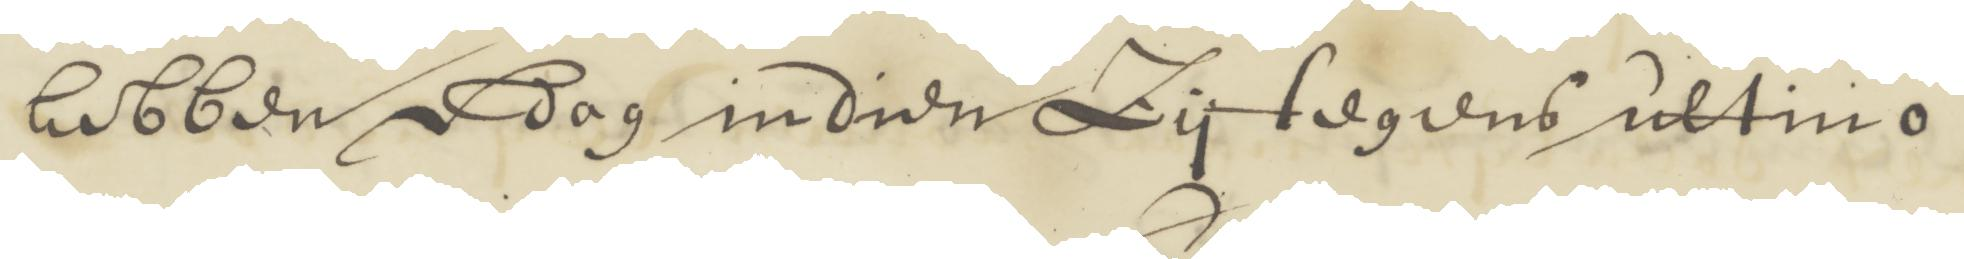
hebben Edog indien zij tegens ultino
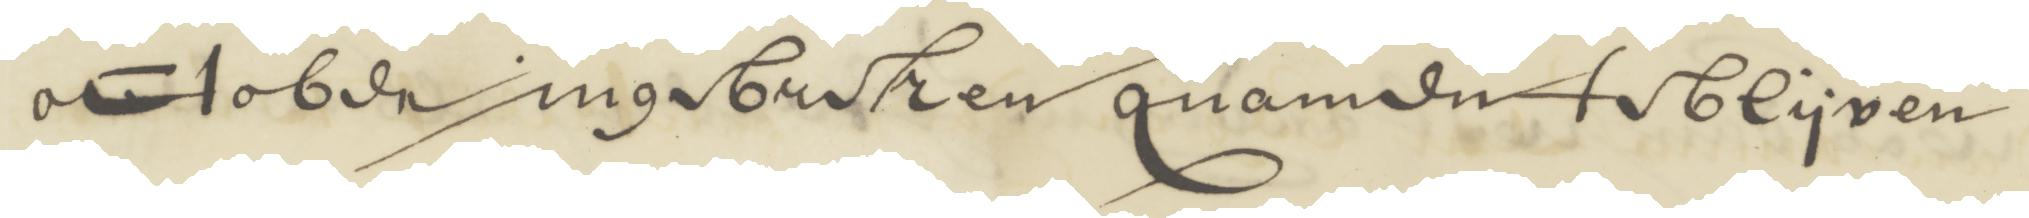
october ingebreken quamen teblijven
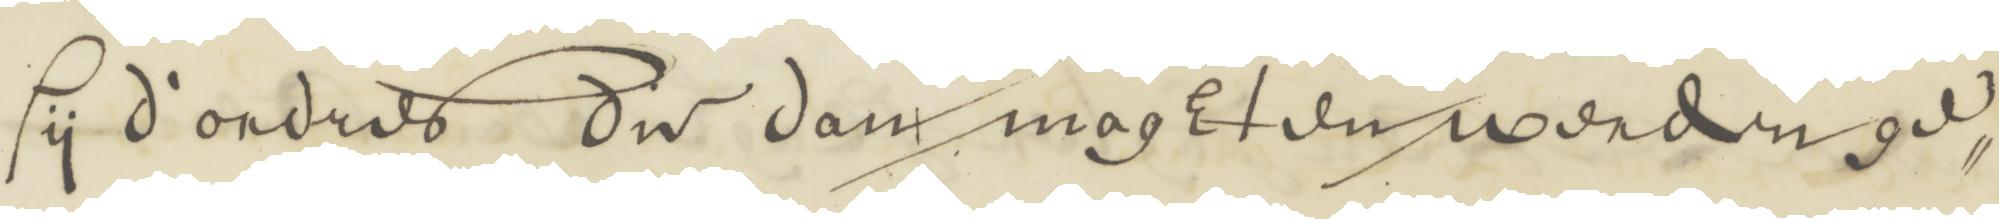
sij d’ordres die dan moghten werden ge„
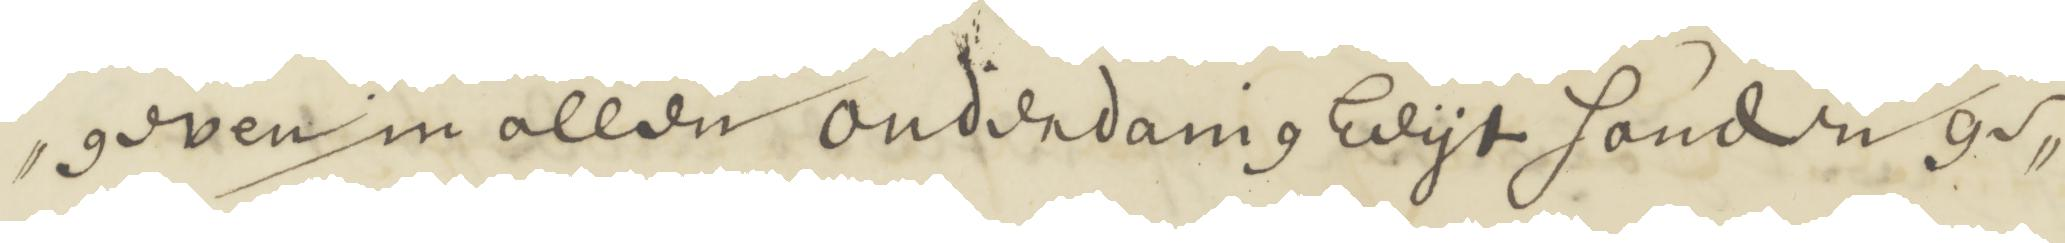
„geven in allen onderdanigheijt souden ge„
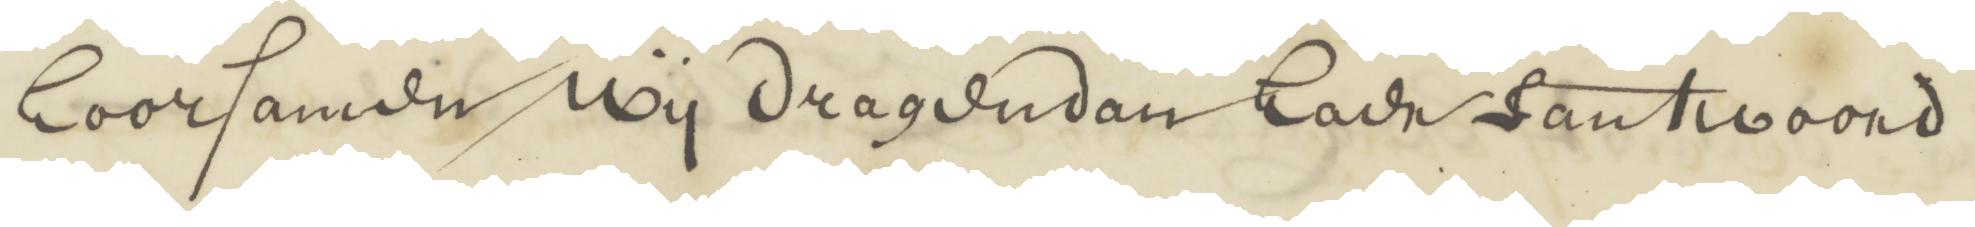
hoorsamen wij dragendan haer E antwoord
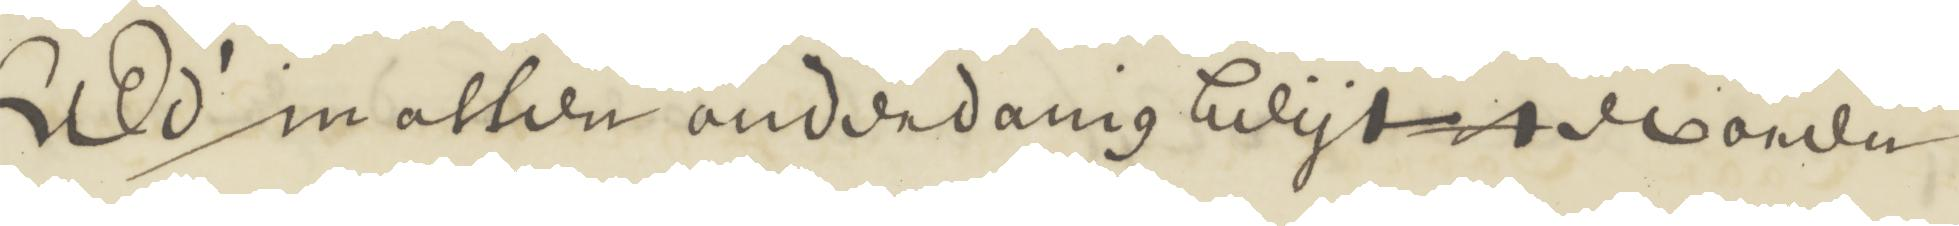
VEd' in allen onderdanigheijt tevoren
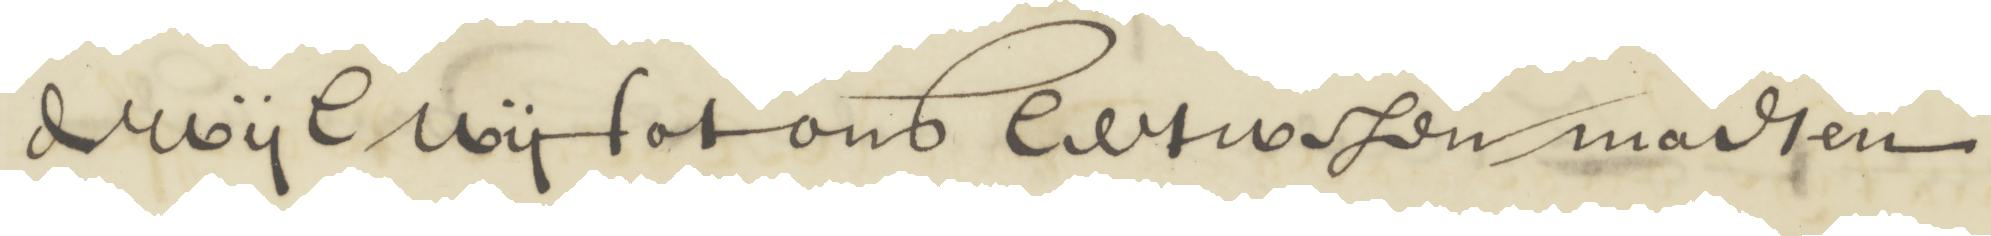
dewijl wij tot ons leetwesen moeten
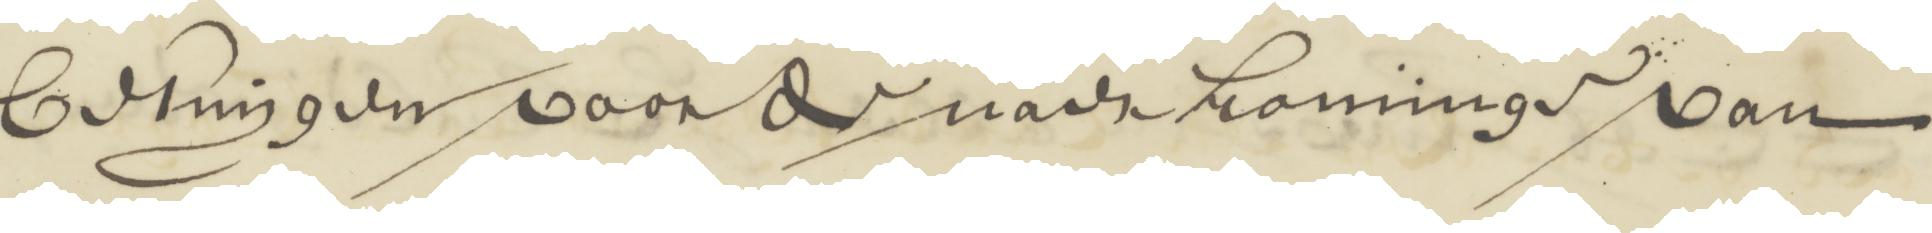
betuijgen voor de naer kominge van
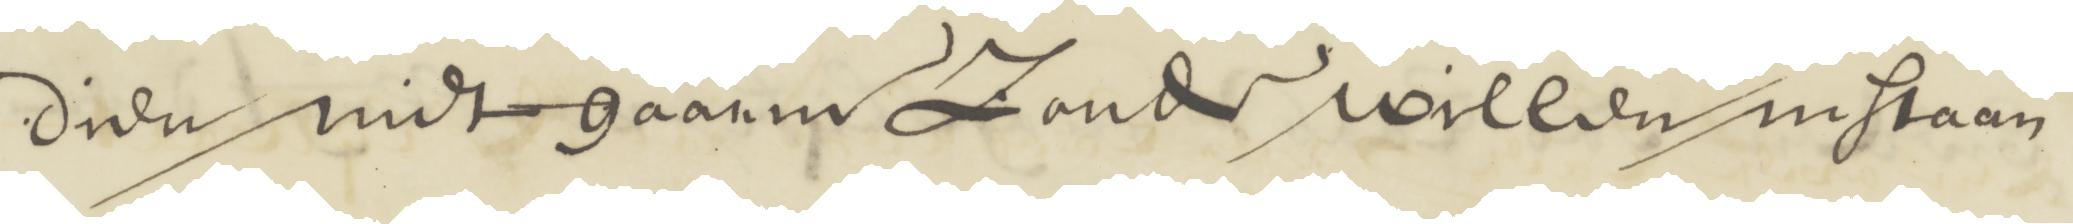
dien niet gaarne zoude willen in staan
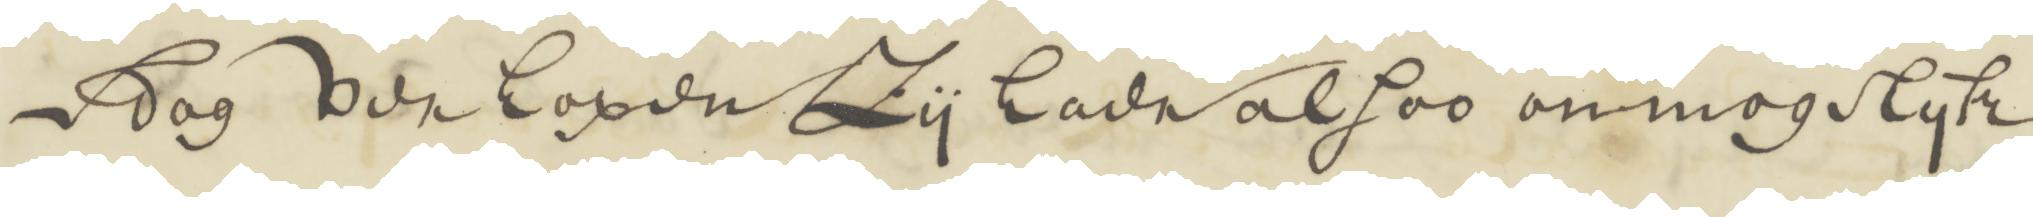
Edog verhopen zij haer alsoo onmogelyk
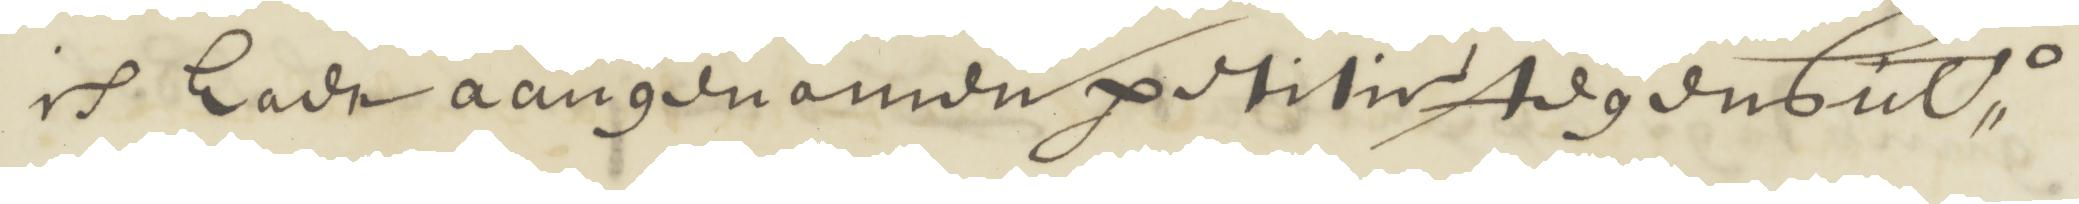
is haer aangenomen petitie tegens ul„to
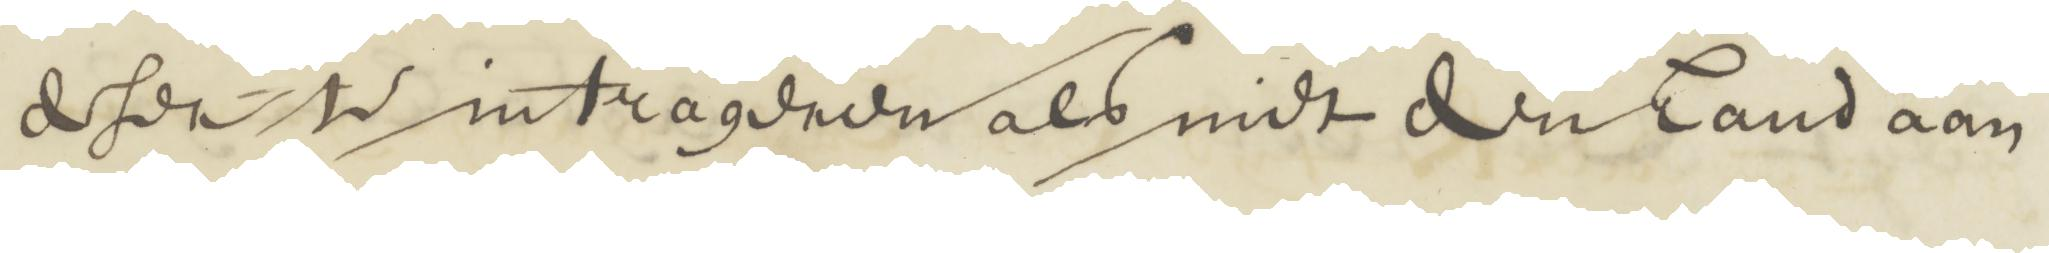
deser te intrageren als met den hand aan
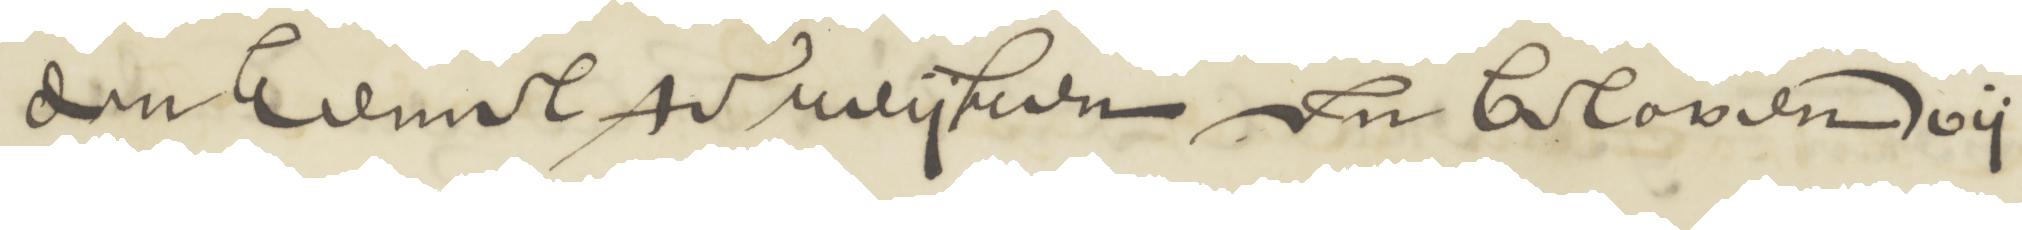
den hemel te reijken En beloven Wij
